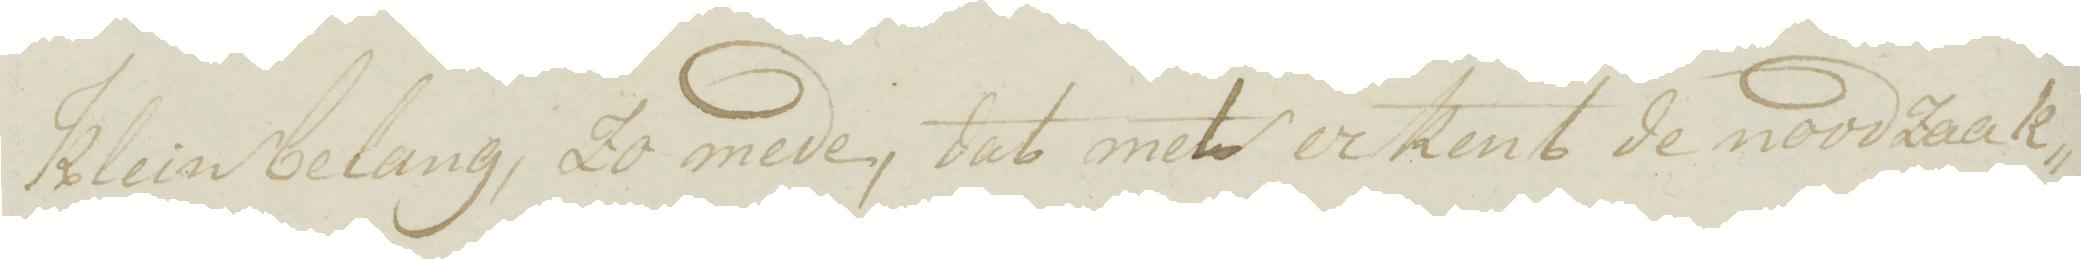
klein belang, zo mede, dat met erkent de noodzaak„
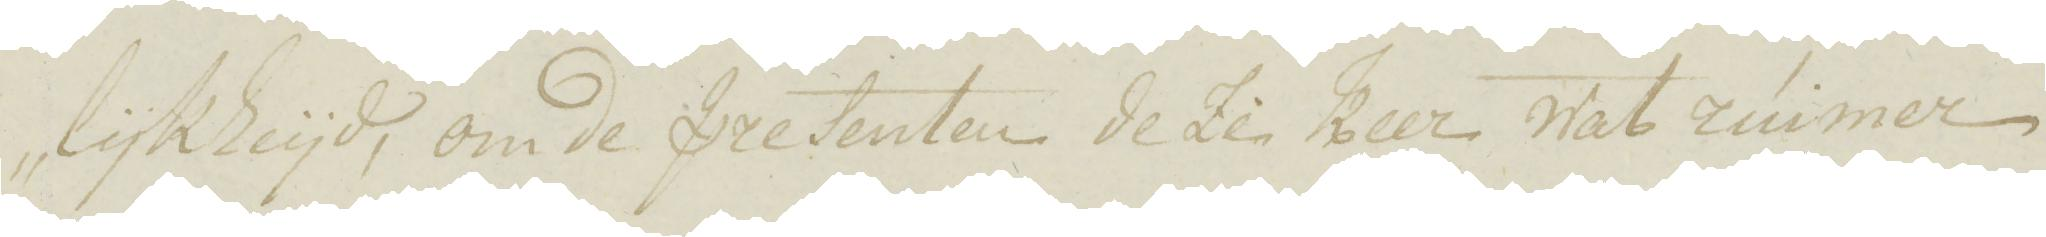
„lijkheijd, om de presenten dezen keer wat ruimer
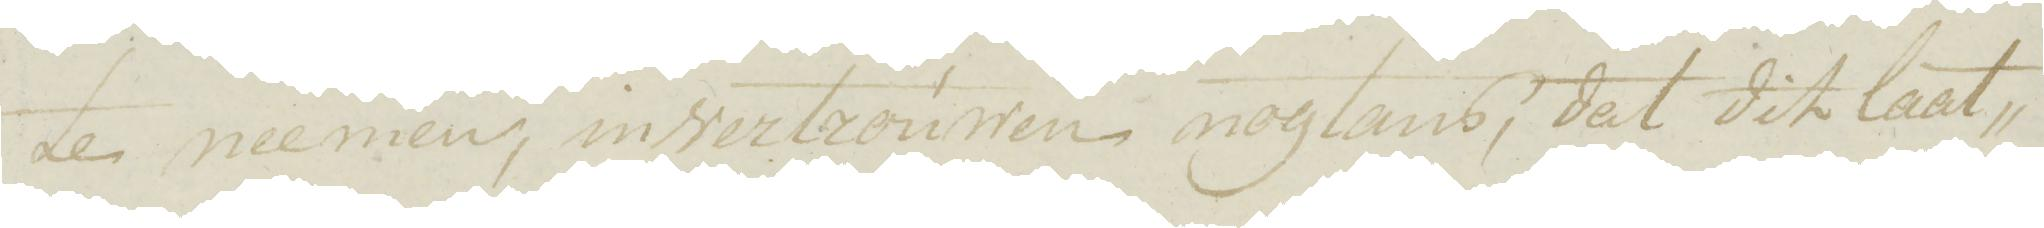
te neemen, in vertrouwen nogtans, dat dit laat„
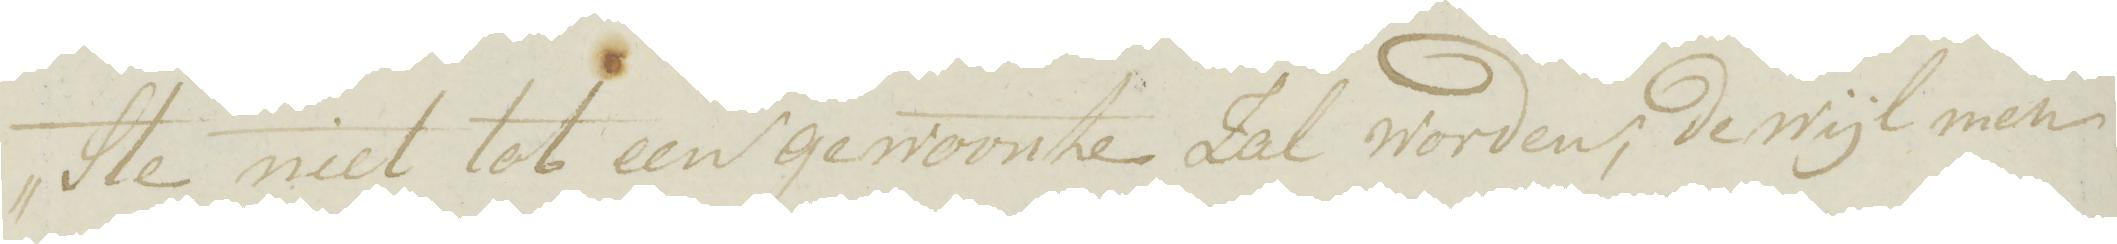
„ste niet tot een gewoonte zal worden, de wijl men
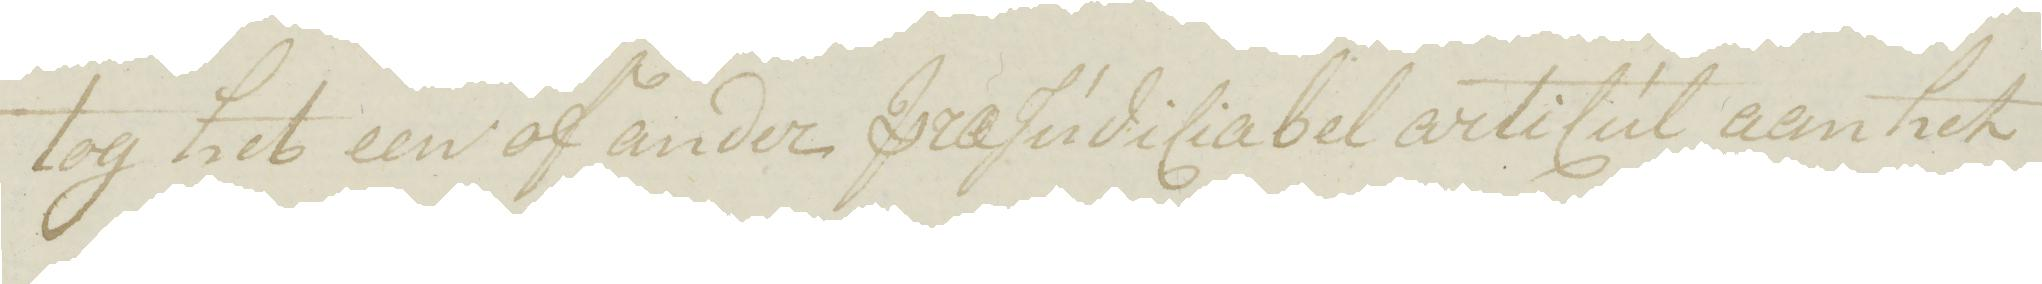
tog het een of ander praejudiciabel articul aan het
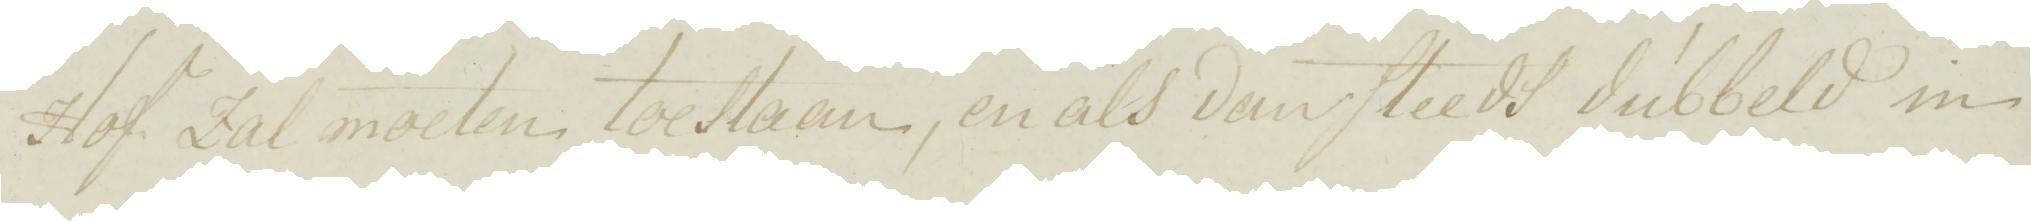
Hof zal moeten toestaan, en als dan steeds dubbeld in
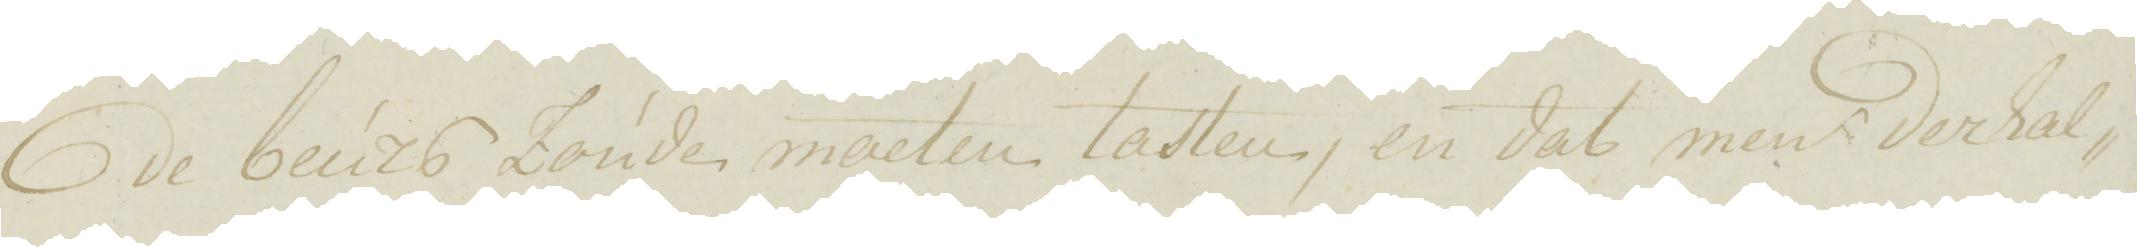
de beurs zouden moeten tasten, en dat men derhal„
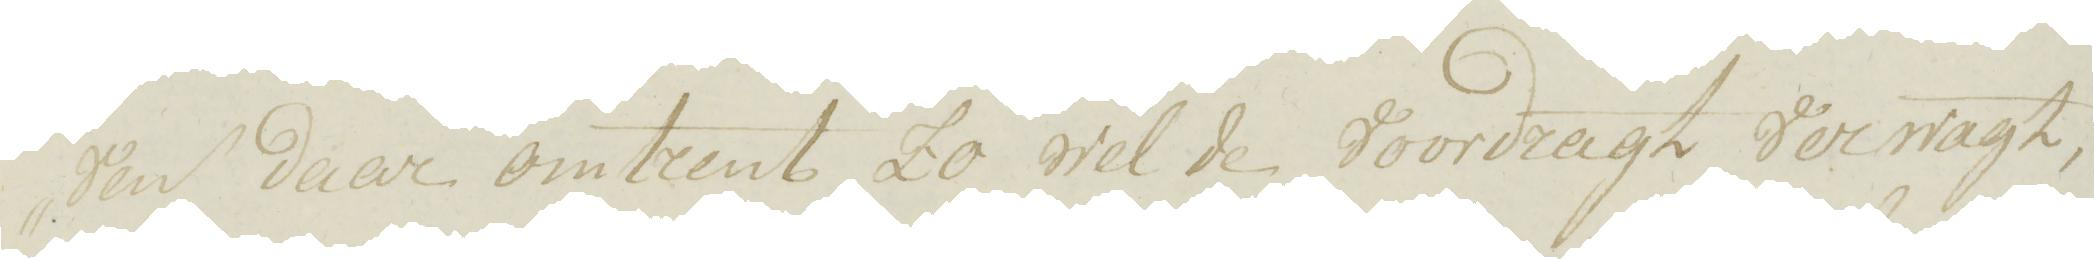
„ven daar omtrent zo wel de voordragt verwagt,
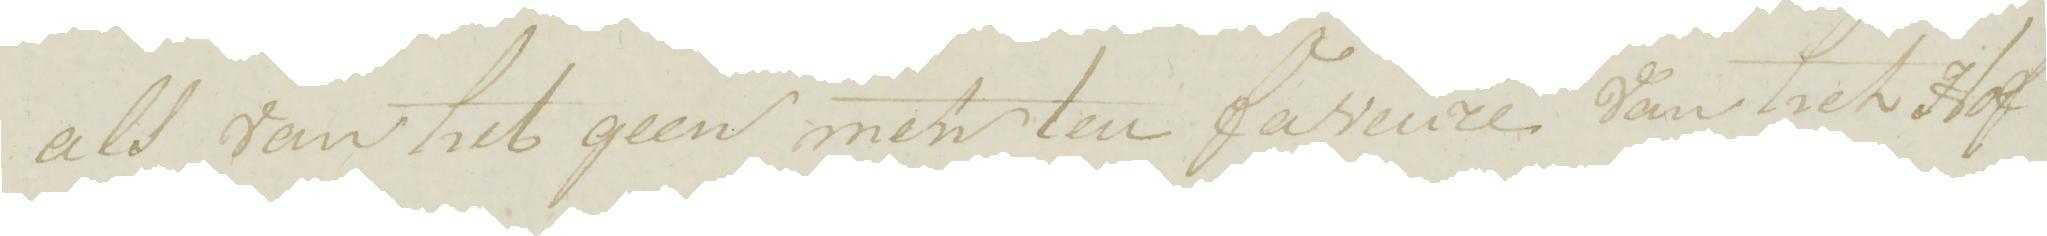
als van het geen men ten faveure van het Hof
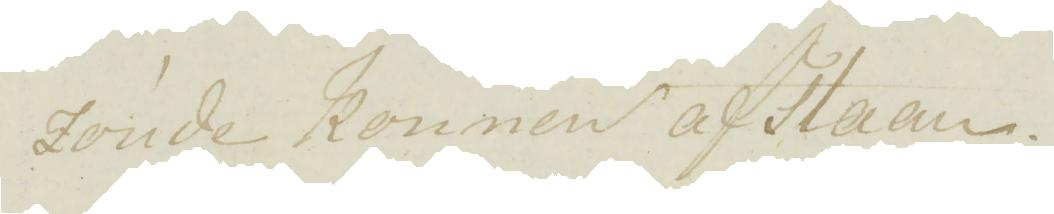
zoude konnen afstaan.
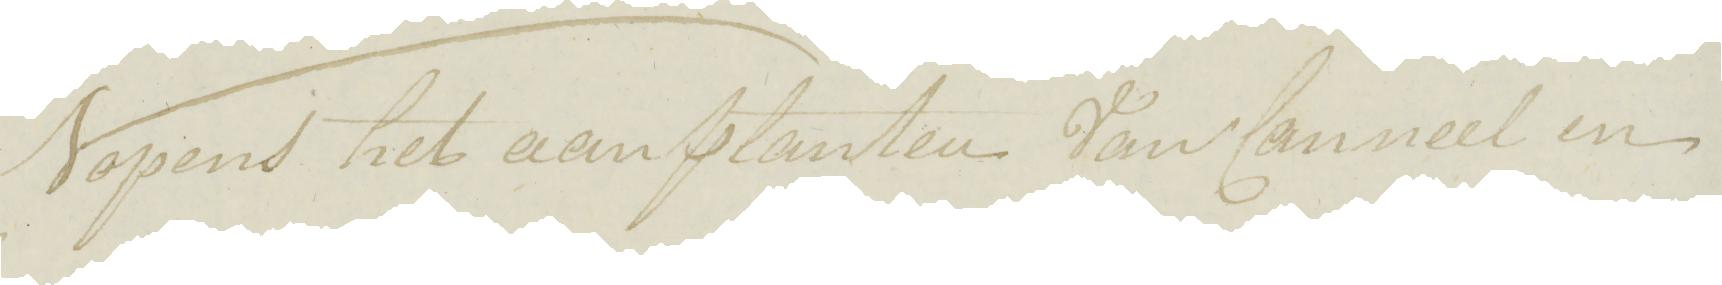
Nopens het aanplanten van canneel en
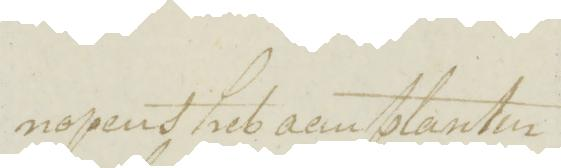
nopens het aanplanten
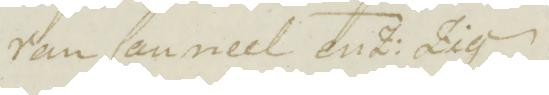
van canneel enz: zig
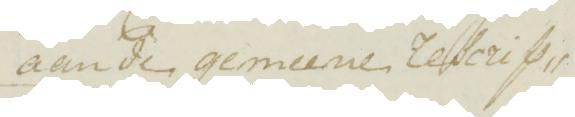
aan de gemeene rescrip„
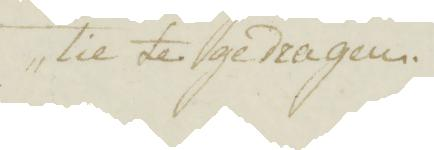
„tie te gedragen.
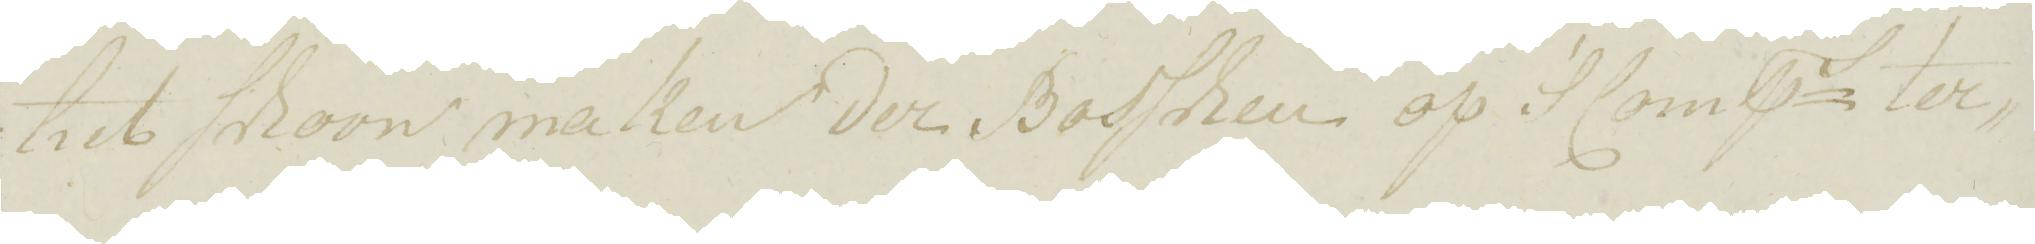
het schoonmaken der Bosschen op ’s Comp=s ter„
